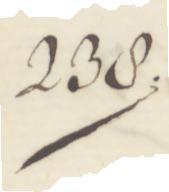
238.
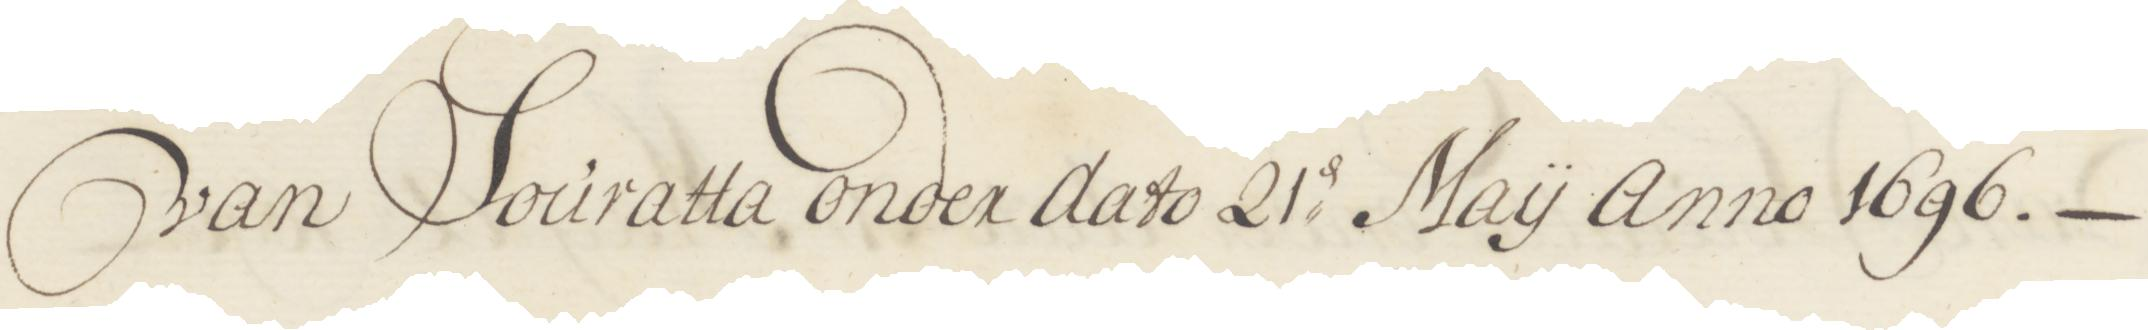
Van Souratta onder dato 21:en Maij Anno 1696. —
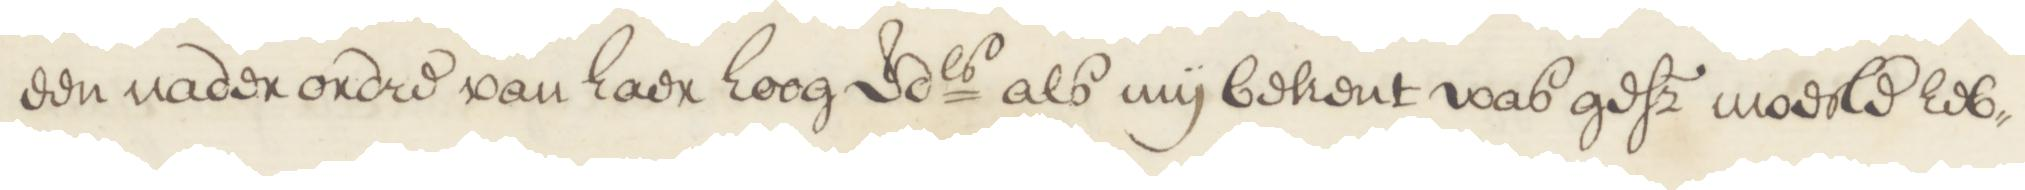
een nader ordre van haer hoog Ed=ls als mij bekent was gesz moeste heb„
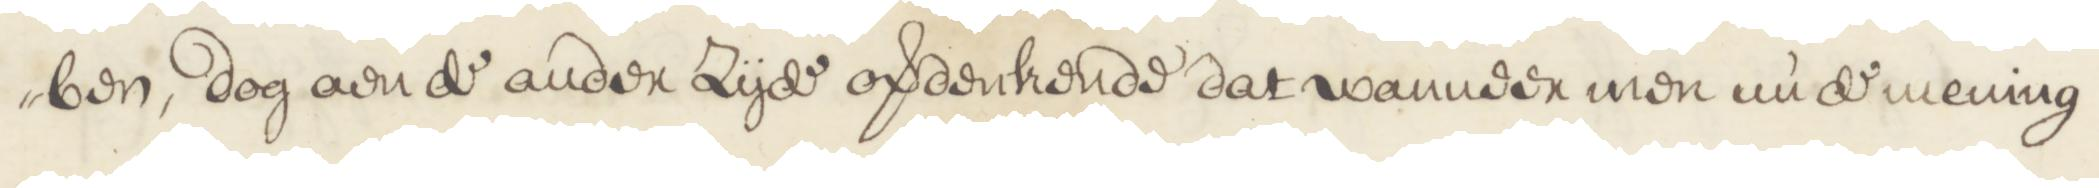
„ben, dog aen de ander zijde overdenkende dat wanneer men nu de mening
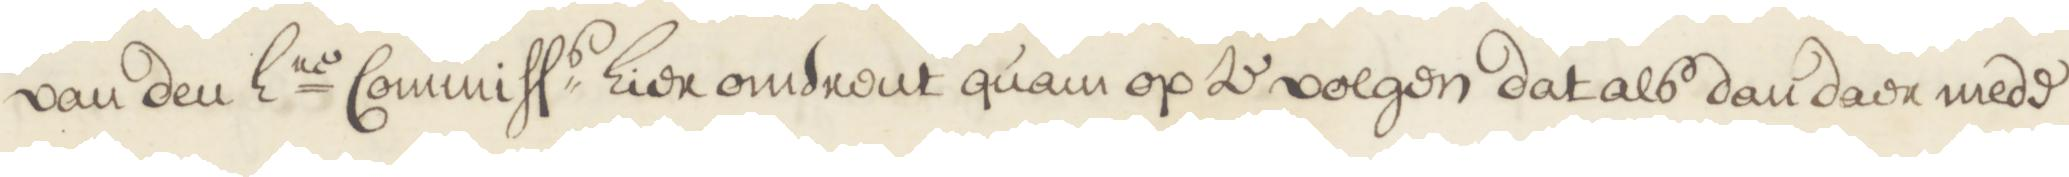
van den h=re Commiss„s hier omtrent quam op te volgen dat als dan daer mede
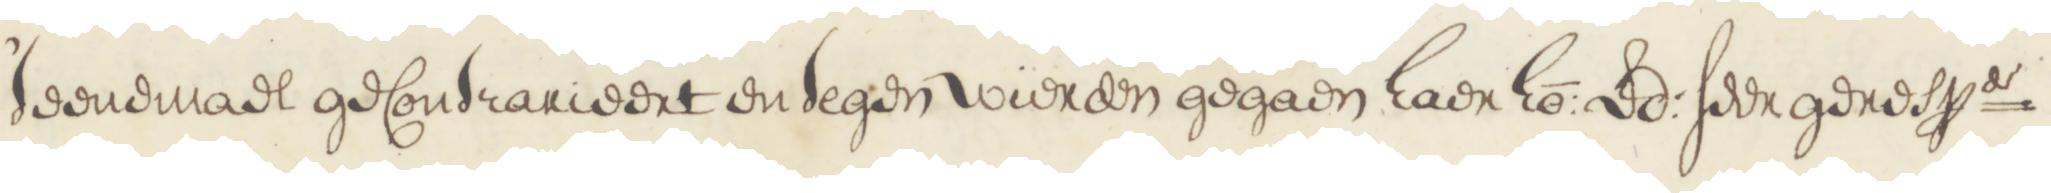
't eenemael gecontrarieert en tegen wierden gegaen haer ho: Ed: seer geresp=de
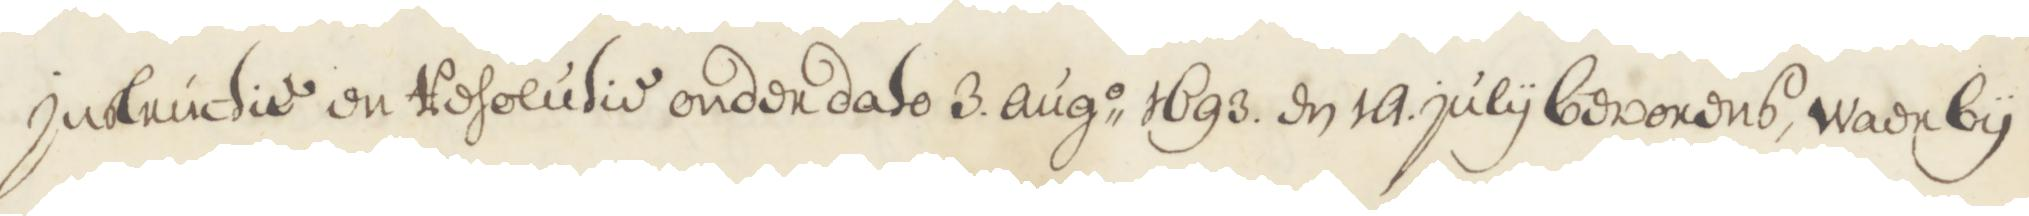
jntructie en Resolutie onder dato 3. aug„o 1693. en 14. julij bevorens, waer bij
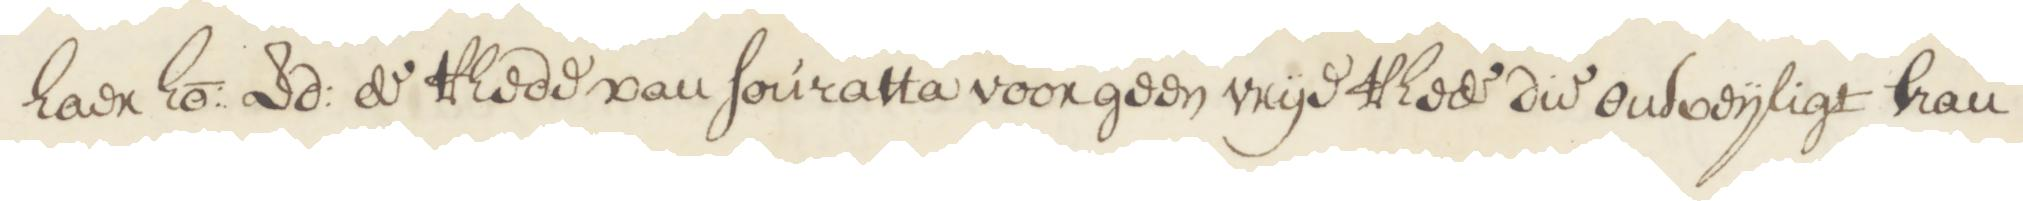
haer ho: Ed: de Rhede van souratta voor geen vrije Rhede die ontveijligt kan
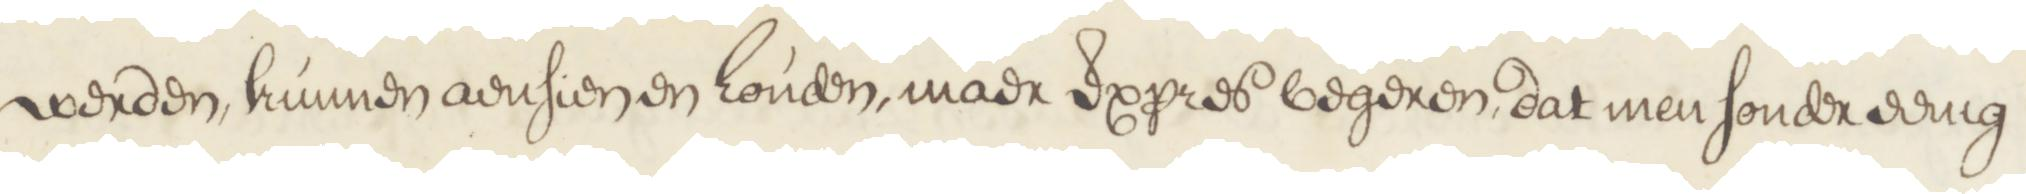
werden, kunnen aensien en houden, maer Expres begeren, dat men sonder eenig
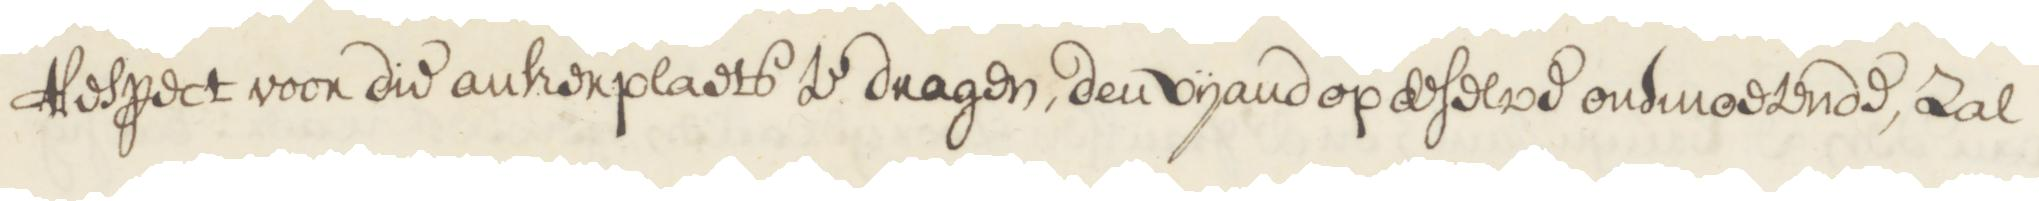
Respect voor die ankerplaets te dragen, den vijand op deselve ontmoetende, zal
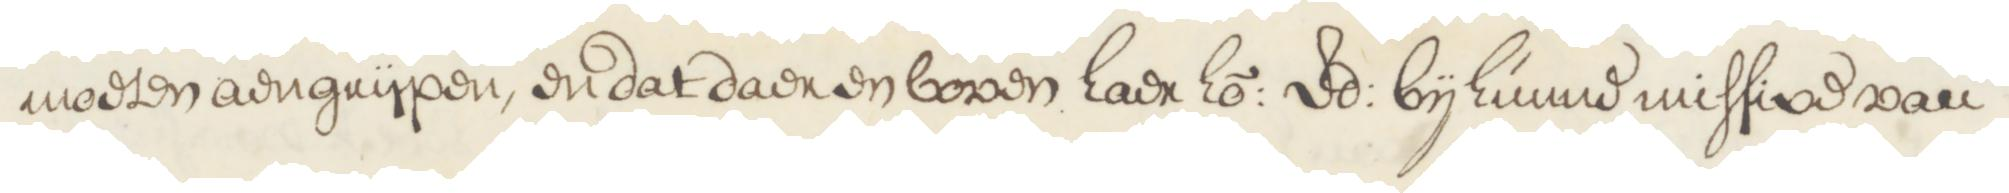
moeten aengrijpen, en dat daer en boven haer ho: Ed: bij hunne missive van
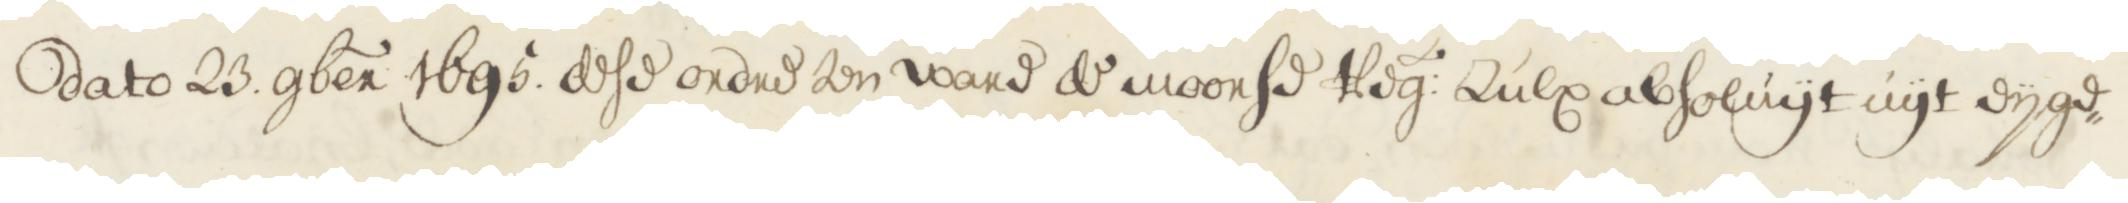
dato 23. gber 1695. dese ordre ten ware de moorse Reg: zulx absoluijt uijt eijge„
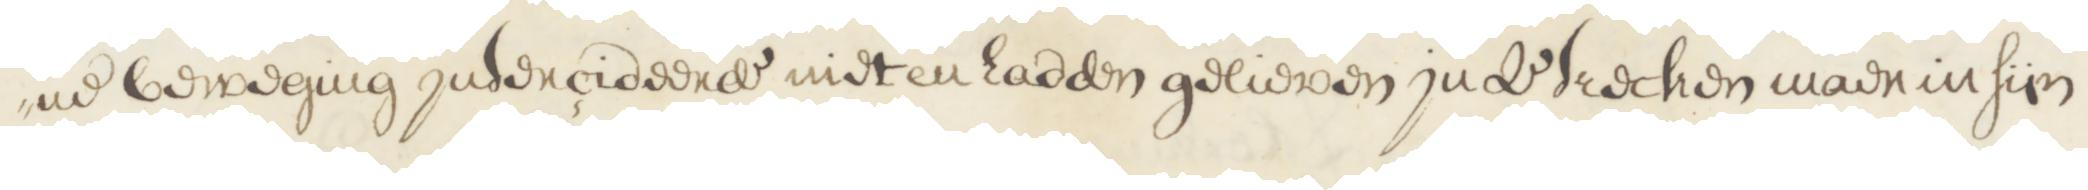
„ne beweging jnterçideerde niet en hadden gelieven jn te trecken maer in sijn
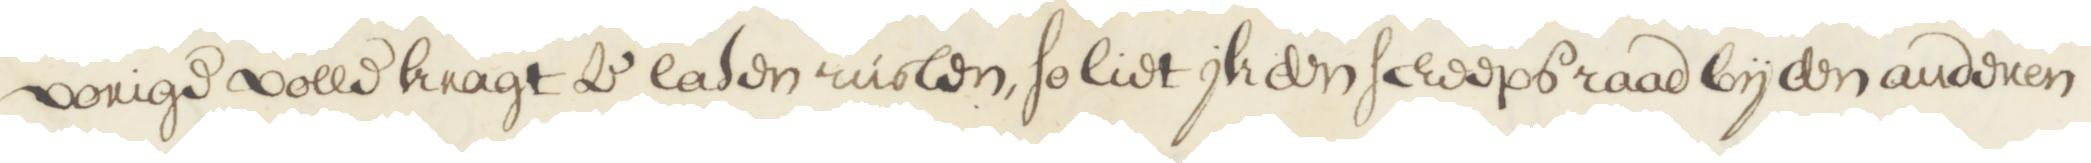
vorige volle kragt te laten rusten, so liet jk den scheeps raad bij den anderen
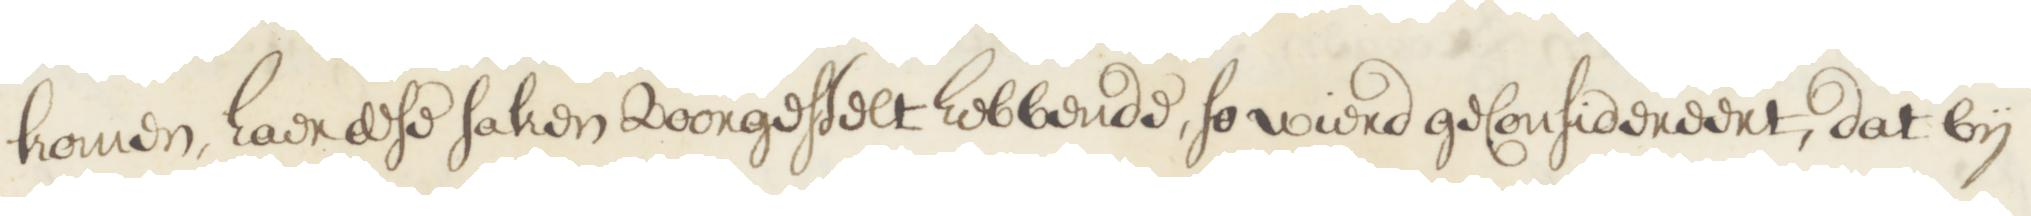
komen, haer dese saken voorgestelt hebbende, so wierd geconsidereert, dat bij
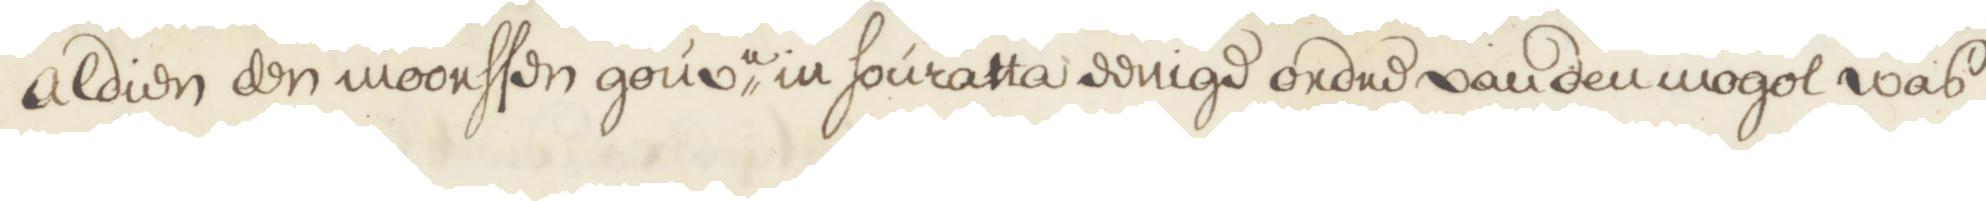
aldien den moorssen gouv„r in souratta eenige ordre van den mogol was
